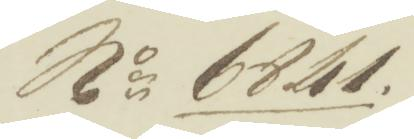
N=o 6841.
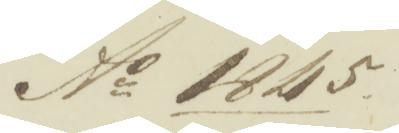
A=o 1845.
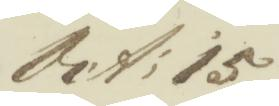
Oct: 15
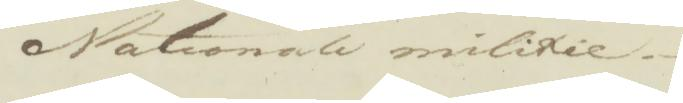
Nationale militie.-
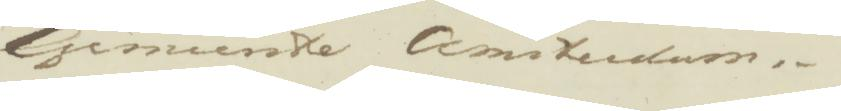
Gemeente Amsterdam,-
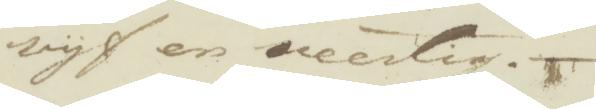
vijf en veertig.—
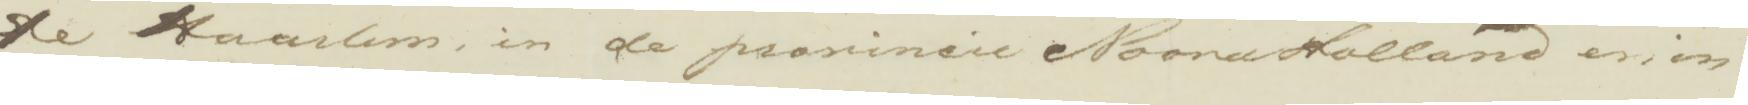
te Haarlem, in de provincie Noord Holland en in
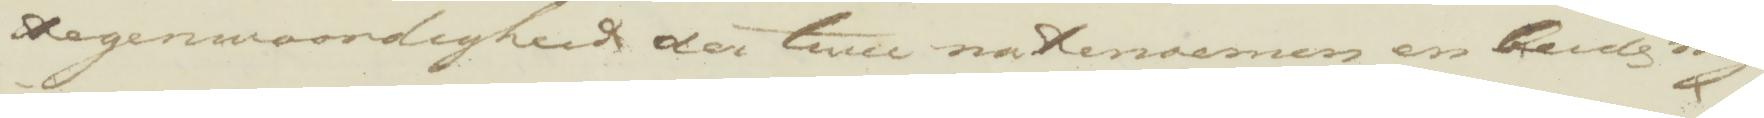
tegenwoordigheid der twee na tenoemen en beide my
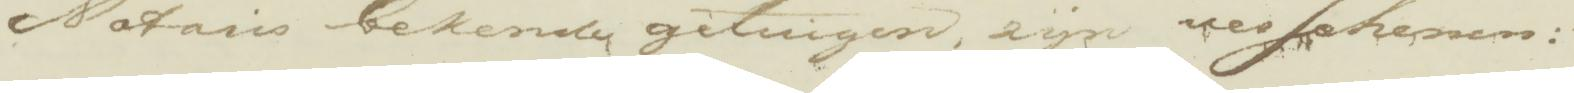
Notaris bekende getuigen, zijn verschenen:
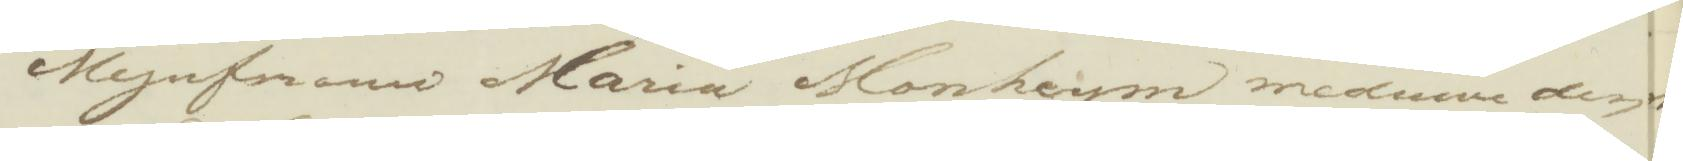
Mejufvrouw Maria Monheym weduwe den
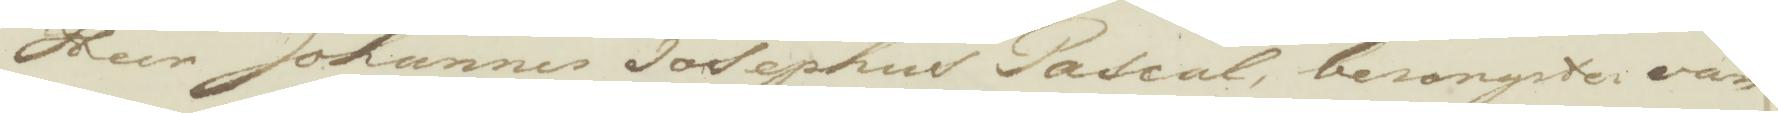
Heer Johannes Iosephus Pascal, bezorgster van
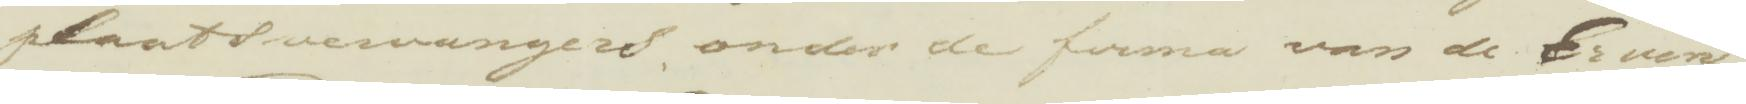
plaatsvervangers, onder de firma van de Erven
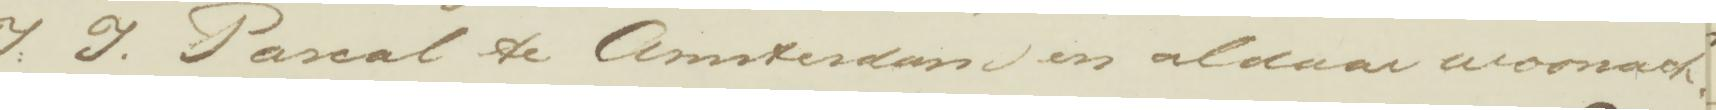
J: I. Pascal te Amsterdam en aldaar woonach
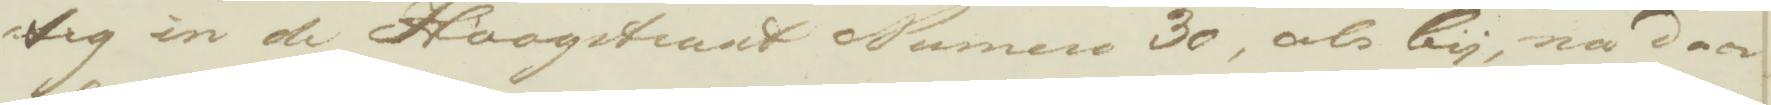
„tig in de Hoogstraat Numero 30, als bij, na door
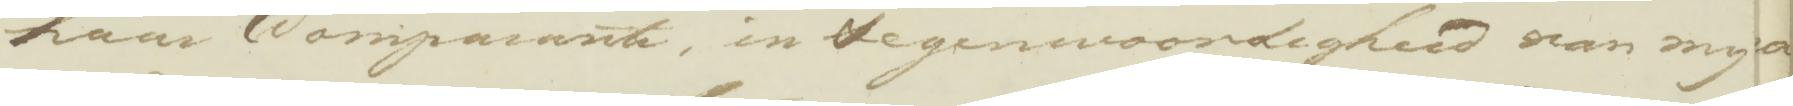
haar Comparante, in tegenwoordigheid van my
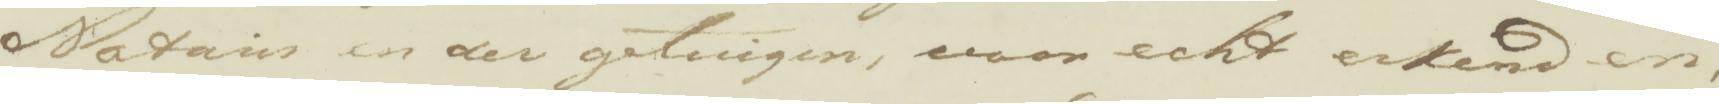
Notaris en der getuigen, voor echt erkend en
